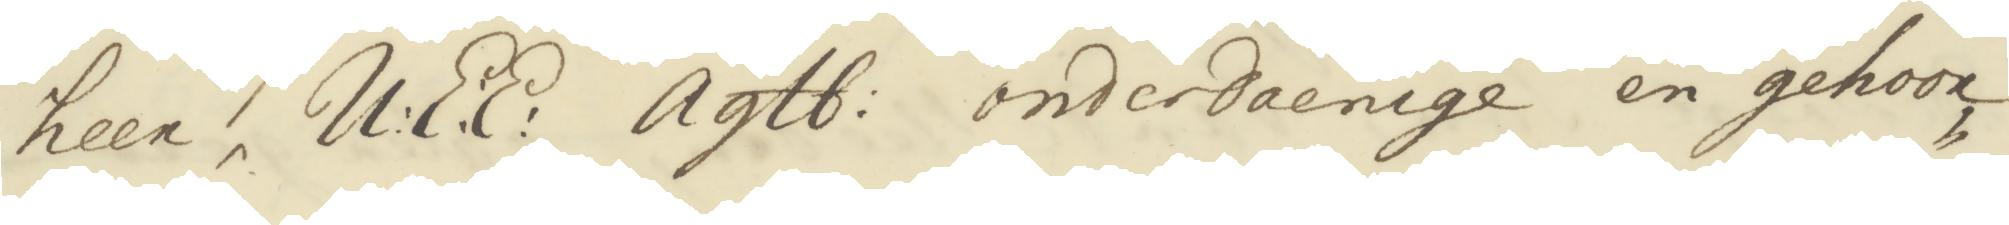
heer, U:E:E: agtb: onderdaenige en gehoor„
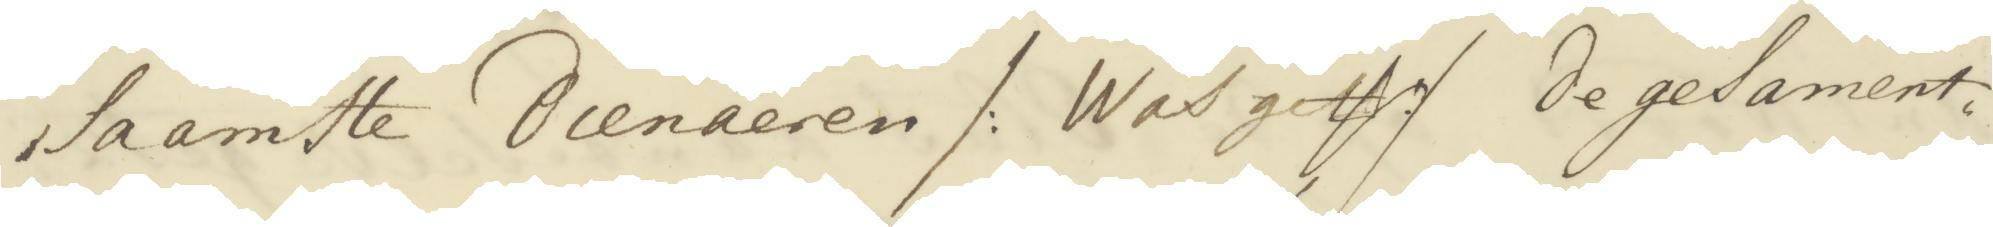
„saamste dienaeren /: was get:/ de gesament„
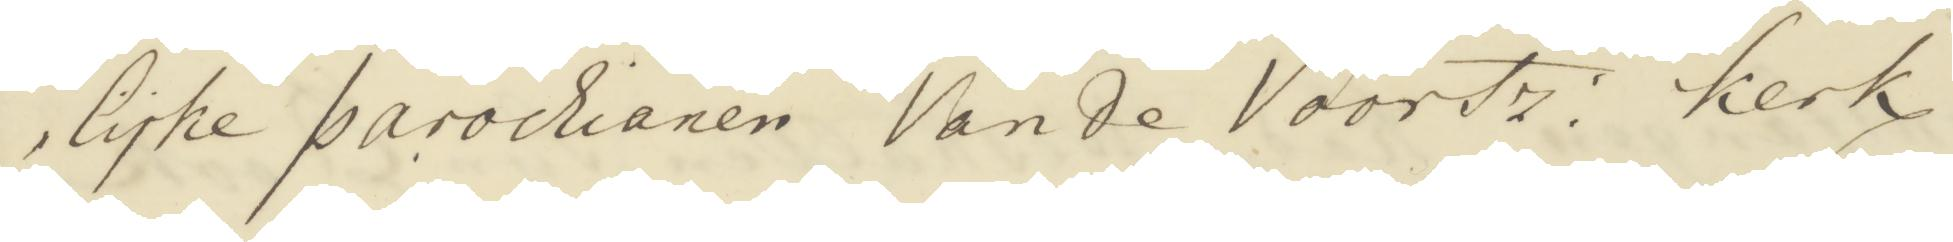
„lijke parochianen van de voorsz: kerk
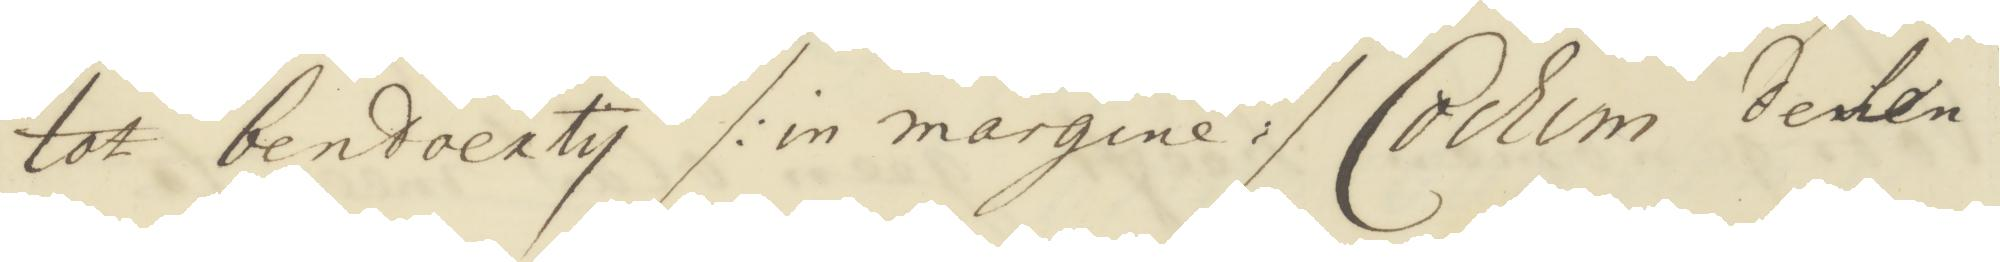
tot bendoertij /:in margine:/ Cochim desen
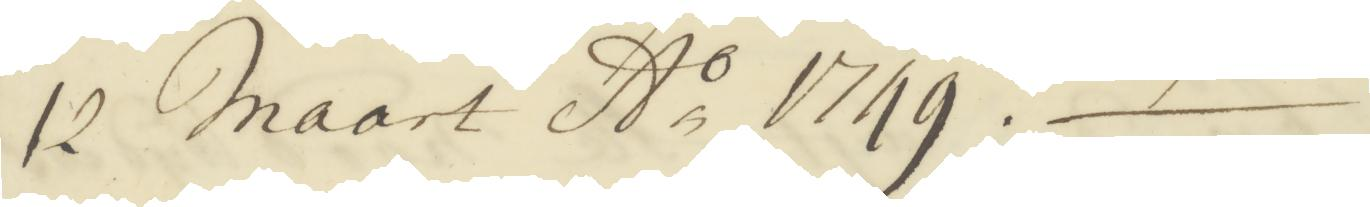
12 Maart A„o 1749. —
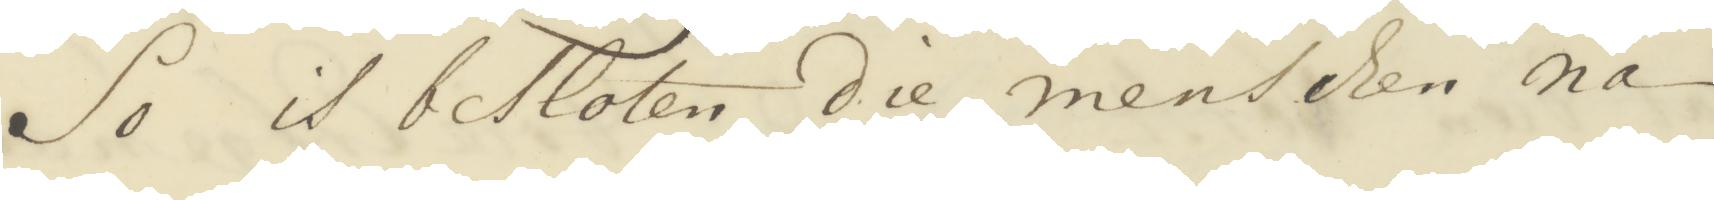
So is besloten die menschen na
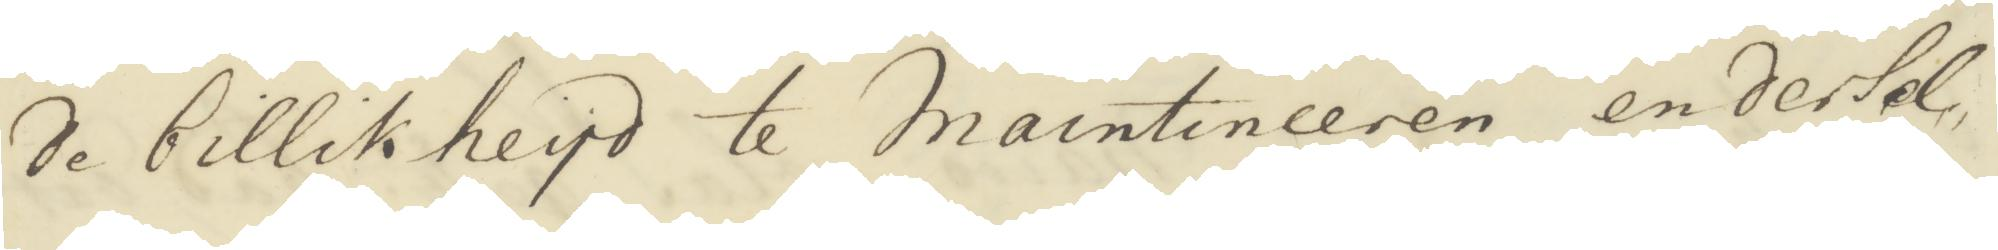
de billikheijd te maintineeren en dersel„
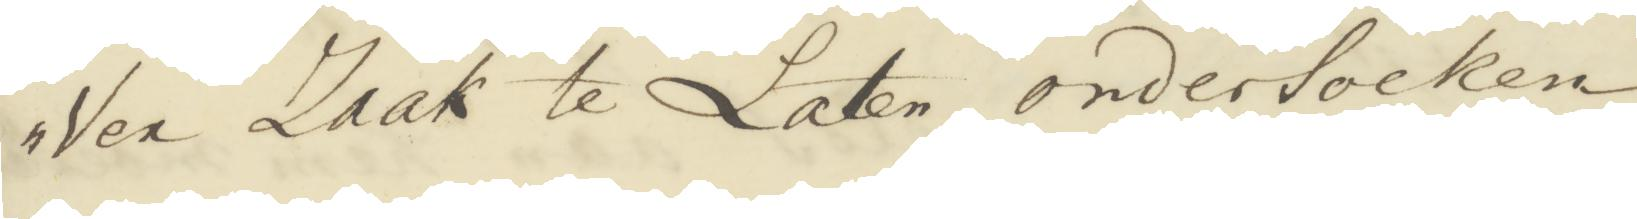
„ver zaak te Laten ondersoeken
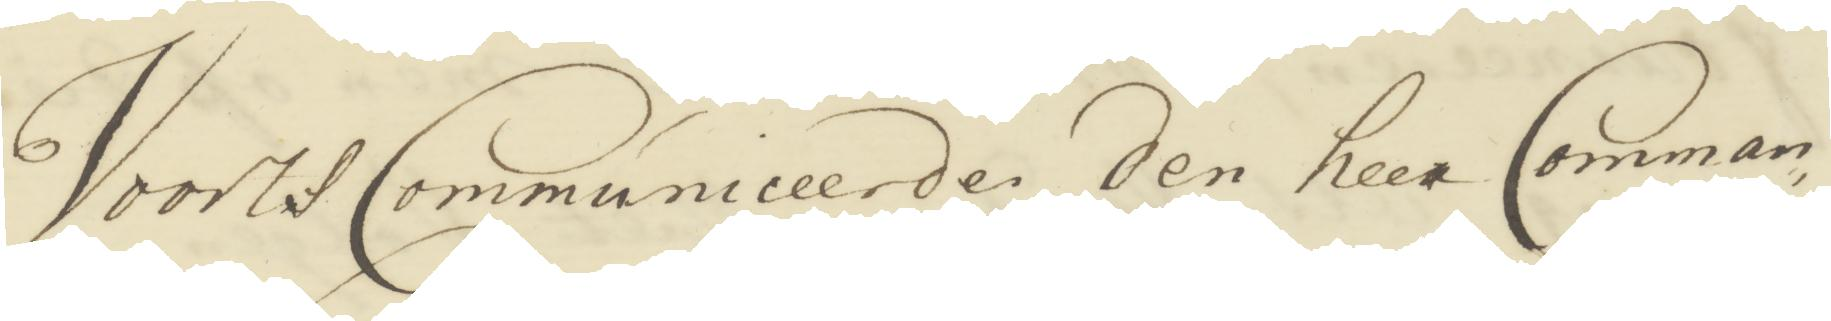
Voorts Communiceerde den heer Comman„
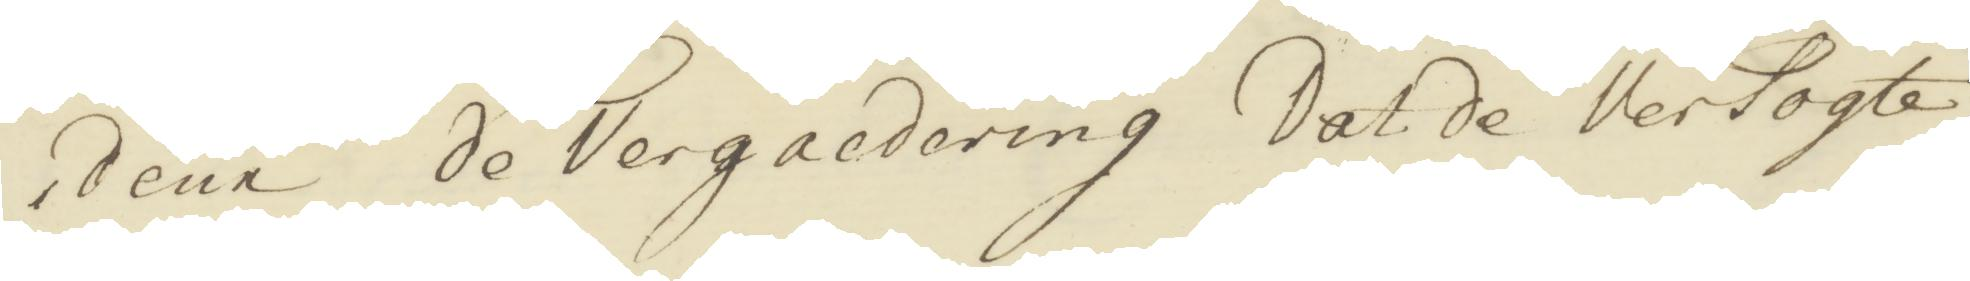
„deur de vergaedering dat de versogte
